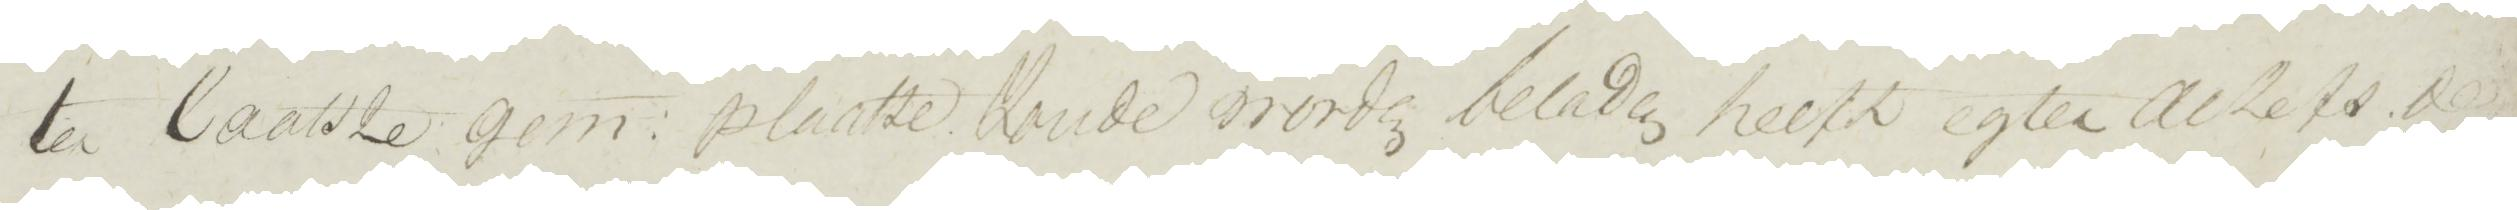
ter laatste: gem: plaatse Zoude worden beladen heeft egterde helft, de
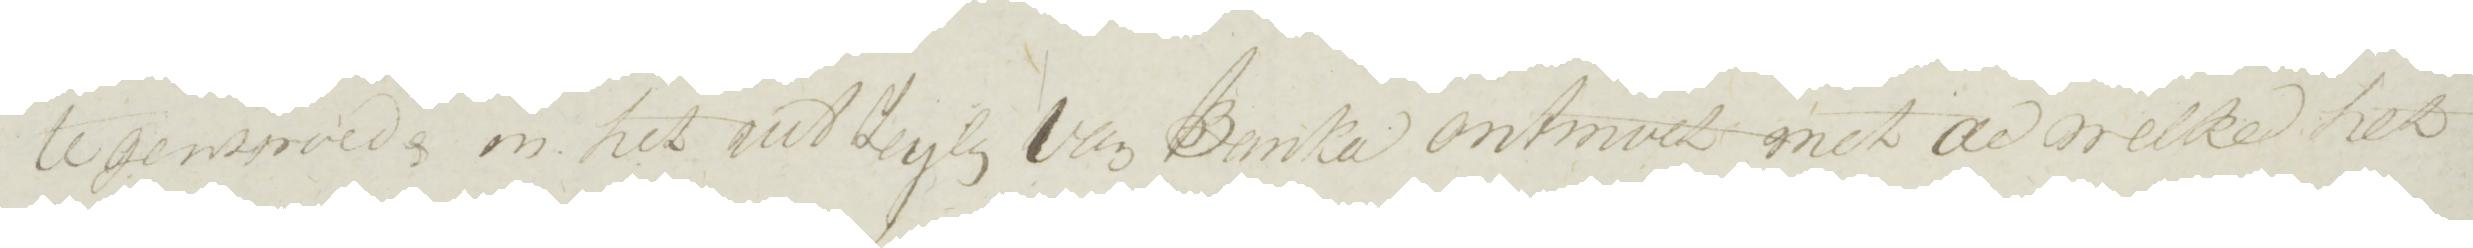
tegenspoeden in het uit Zeijlen van Banka ontmoet met de welke het
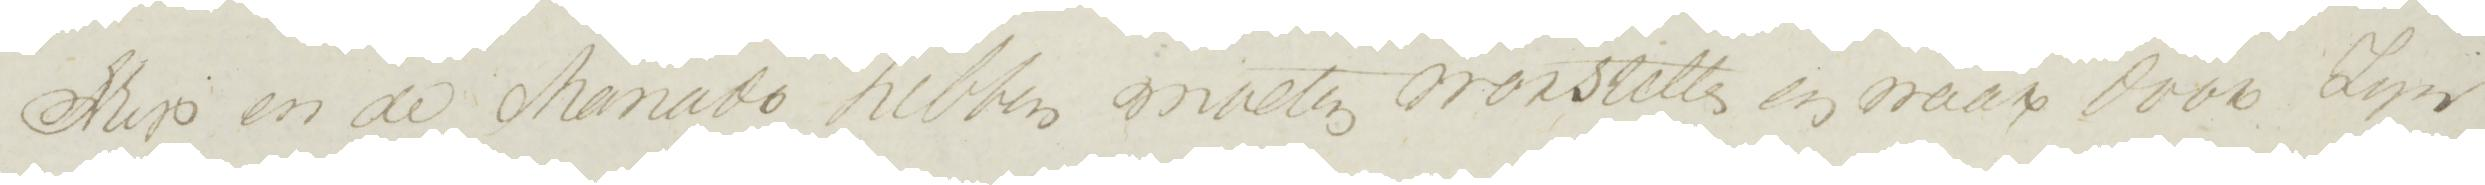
Schip en de Manado hebben moeten worstelten en waar door Zyn
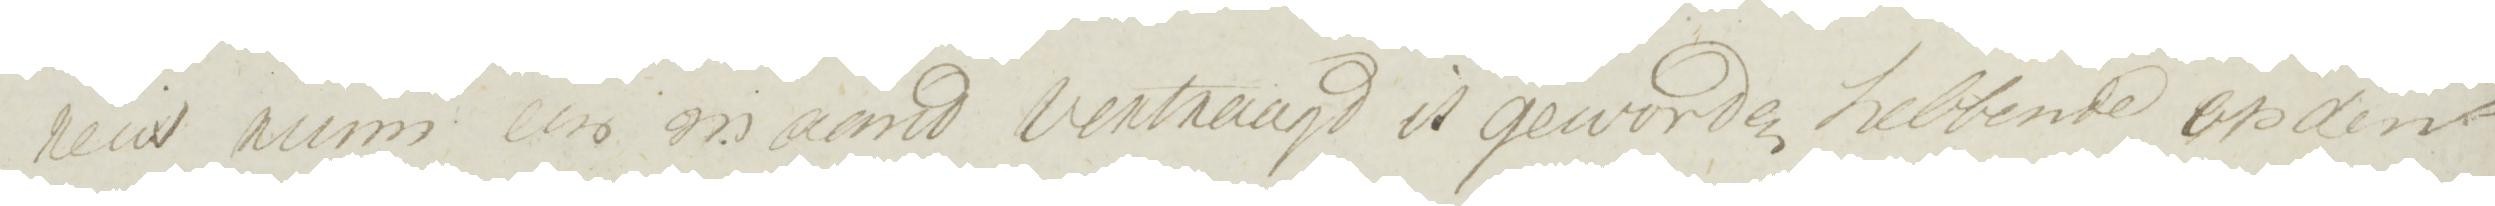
reiis ruim een maand vertraagd is geworden hebbende op den
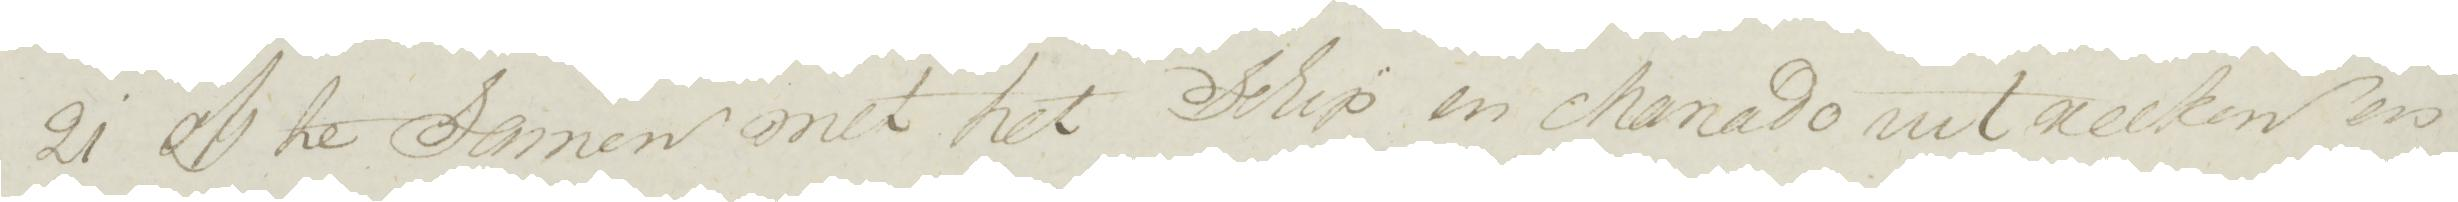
21 of te Samen met het Schip en Manado uit reeken en
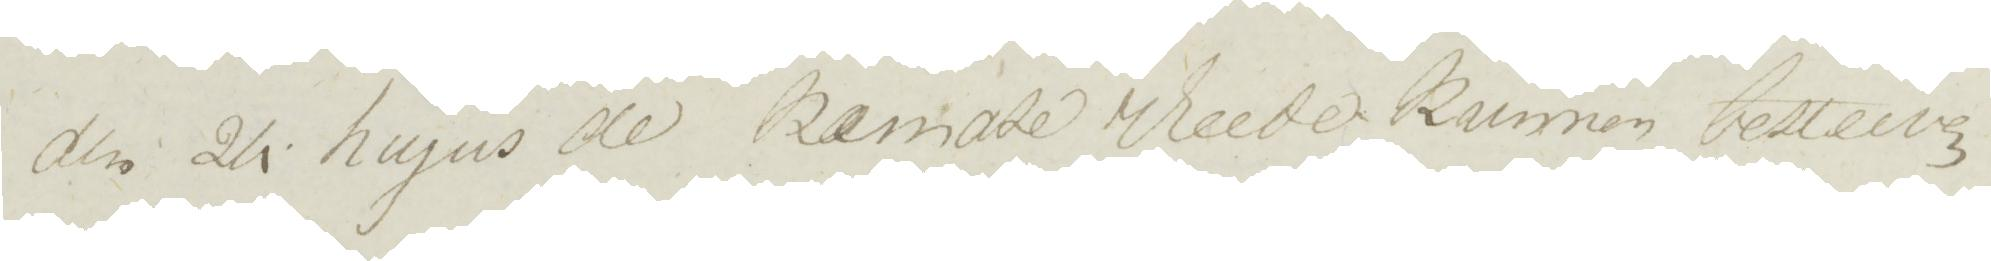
den 24 hujus de Kemase rheede kunnen besteeven
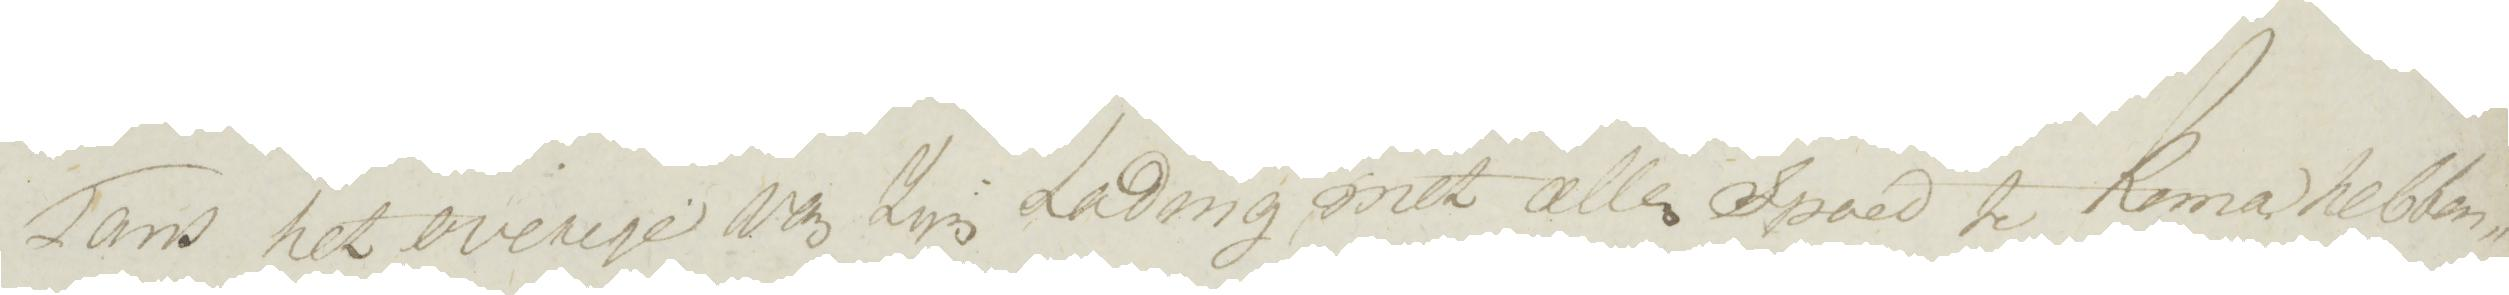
Tans het overige van Zijn Lading met allen spoed te Kema hebben„
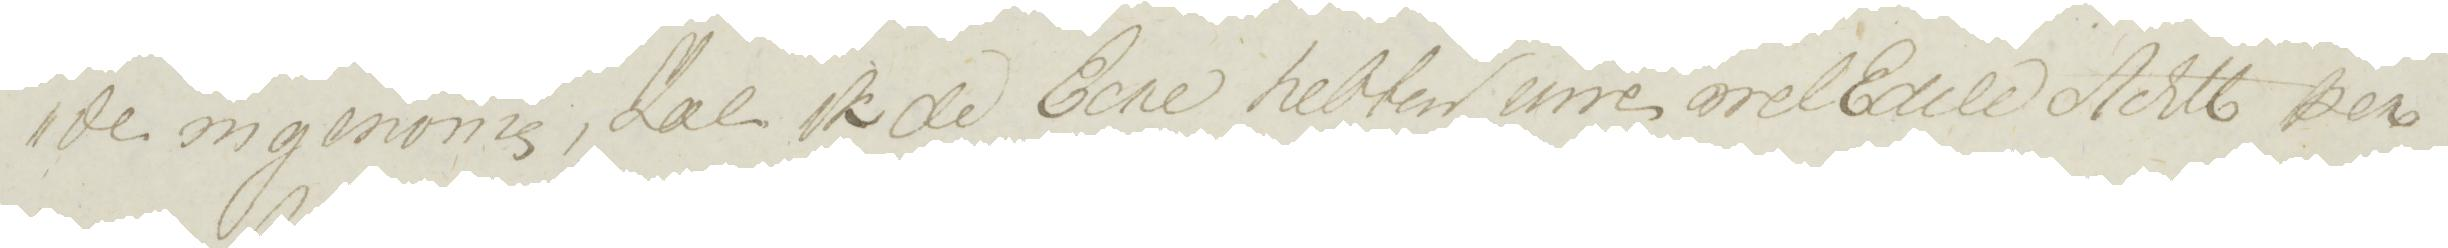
„de ingenomen, Zal ik de Eere hebben uwe wel Edele Achtb per
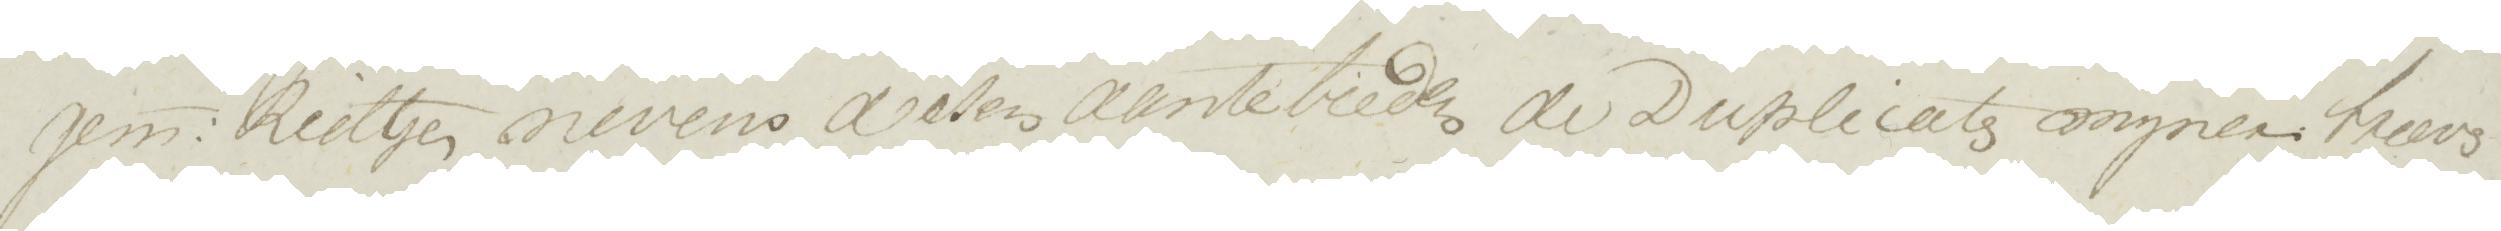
gem: Kieltjen nevens deesen aante bieden de Duplicaten myner brieven
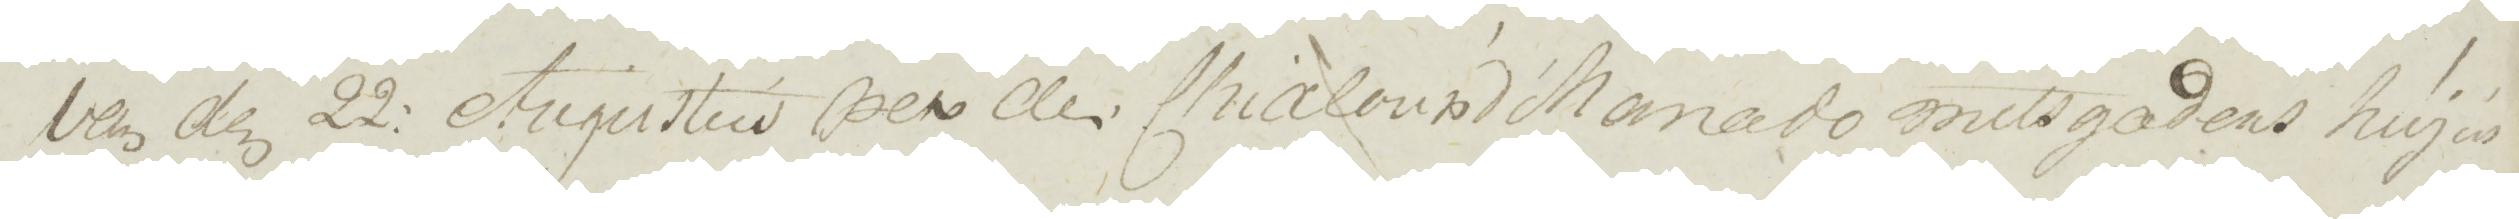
van den 22: Augustus per den Chialoupd Manado mitsgaders hujus
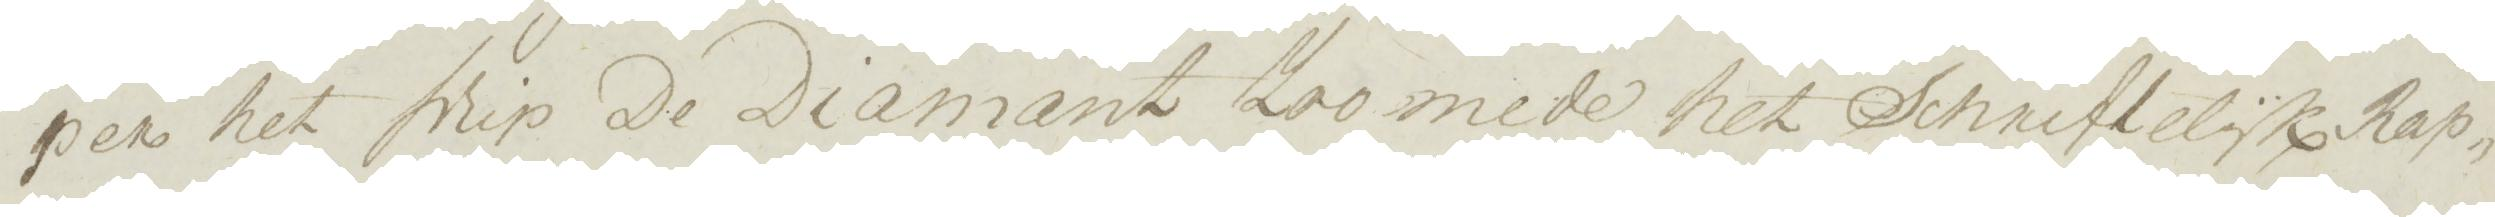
per het schip De Diamant Zoo mede het Schriftelijk Rap„
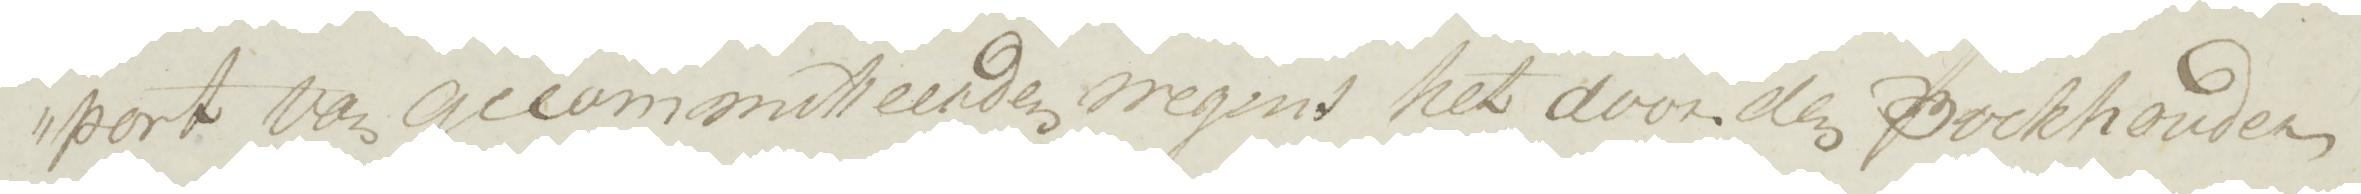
„port van gecommitteerden wegens het door den Boekhouder
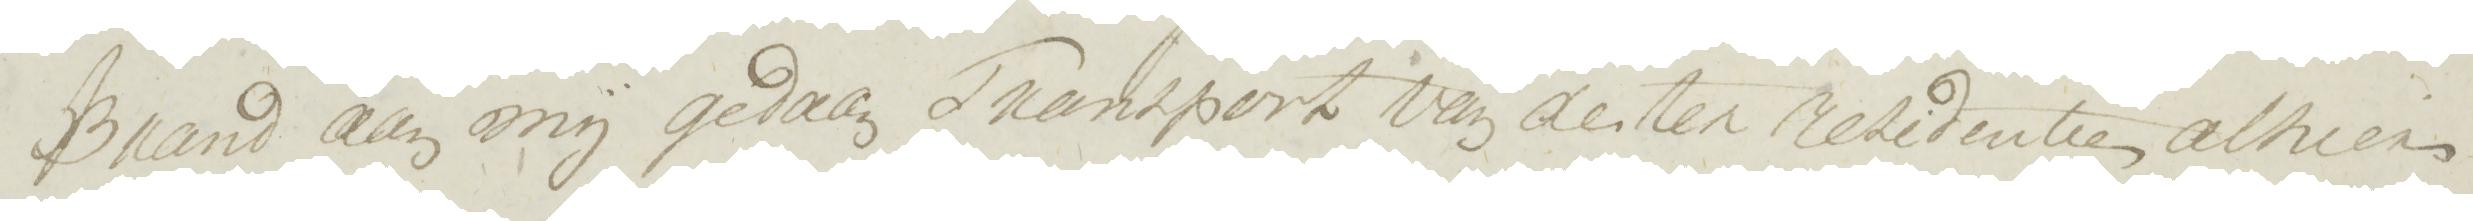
Brand aan mij gedaan Transport van de ter residentie alhier
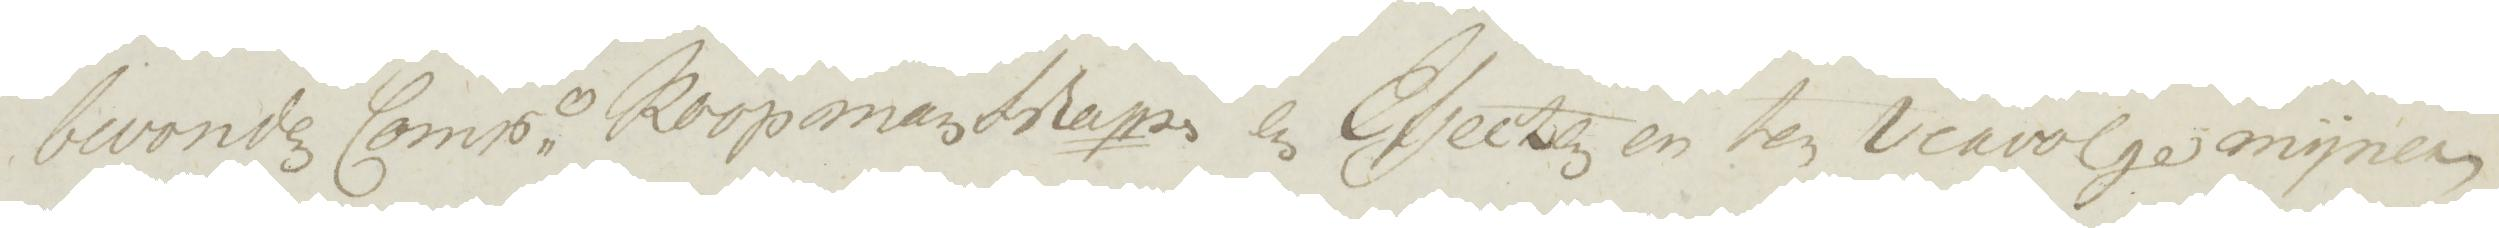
bevonden Comp„s Koopmanschappen en Effecten en ten vervolge mijner
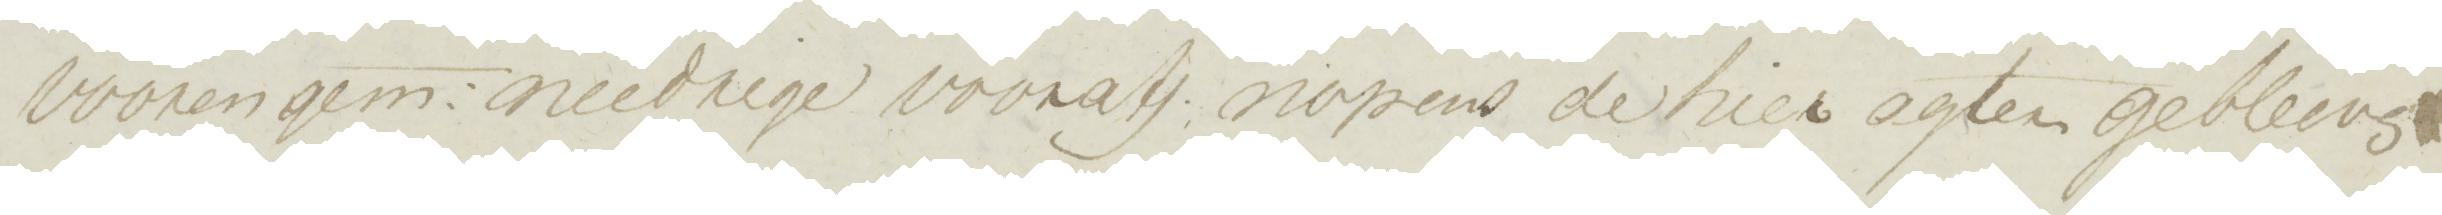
vooren gem: needrige voor afj: nopens de hier agter gebleeven
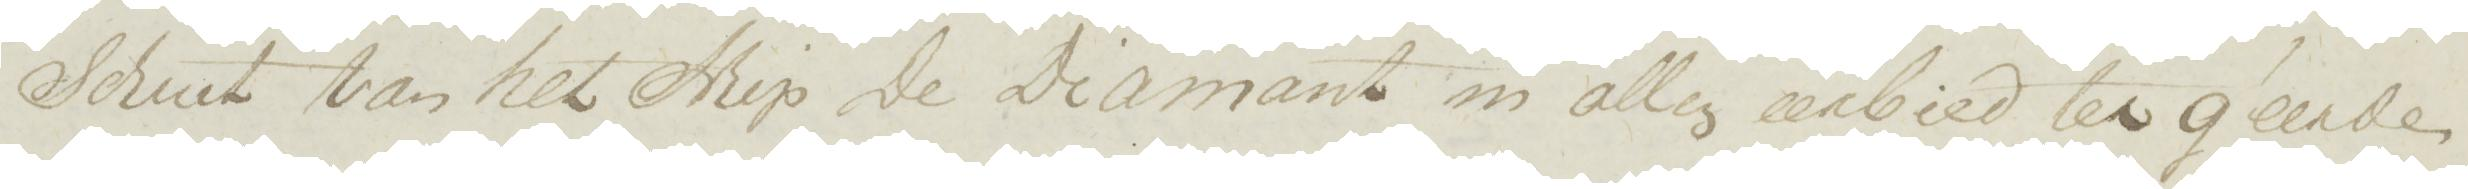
Schuit van het schip de Diamant in allen eerbied ter g’eerde
